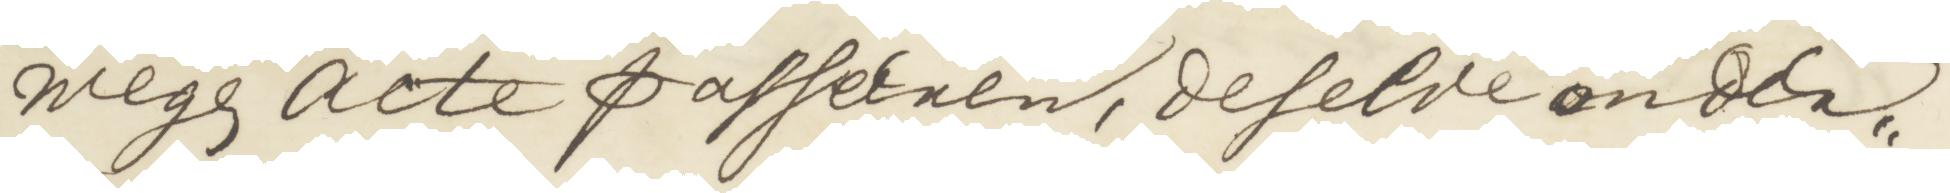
wegen acte passeeren, deselve onder„
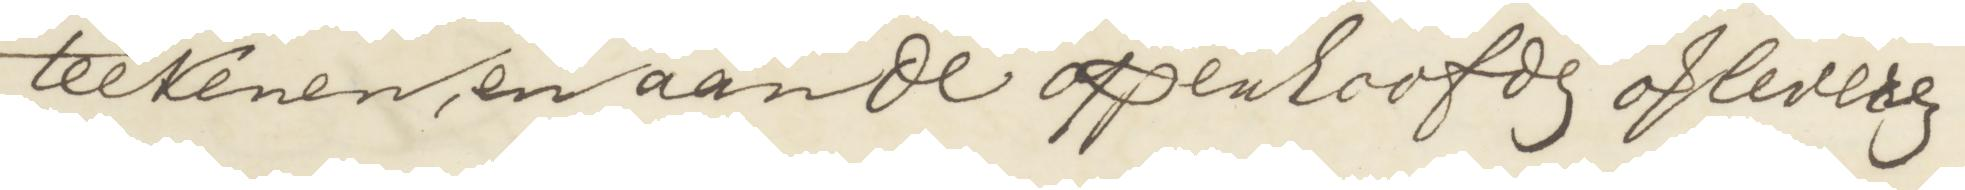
teekenen, en aan de opperhoofden overleveren
